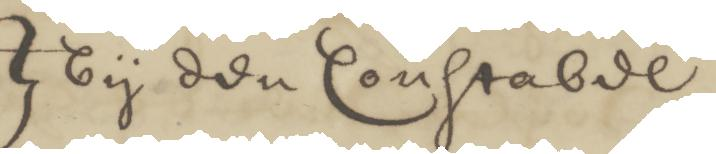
} bij den Constabel
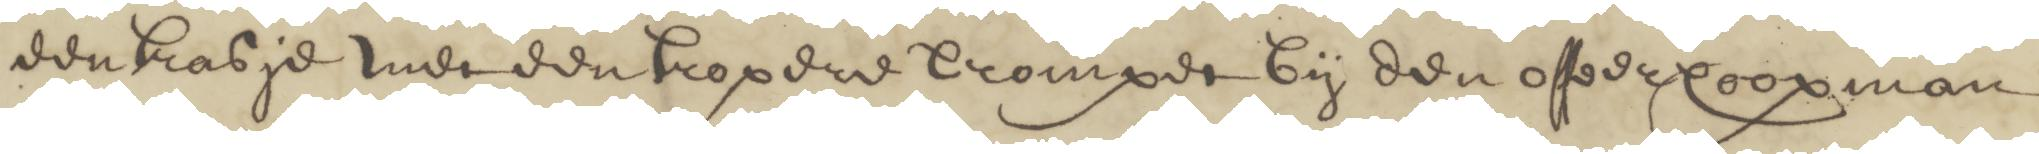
een kasje met een kopere Trompet bij den oppercoopman
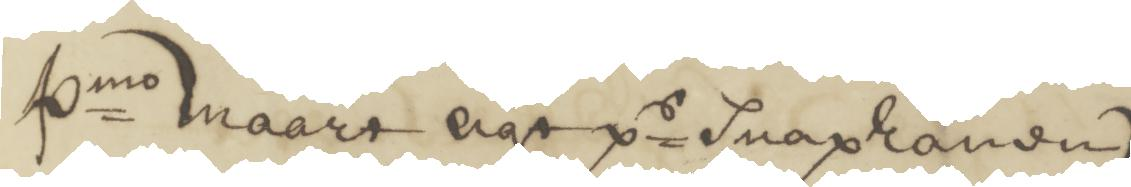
P=mo Maart agt p=s snaphanen
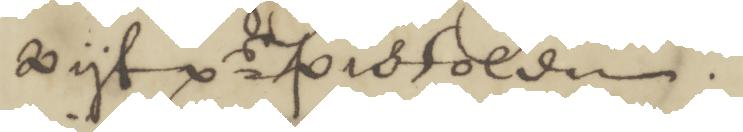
vijf p=s pistolen -
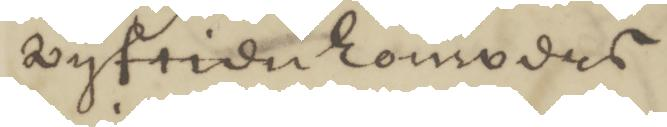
vijftien houwers
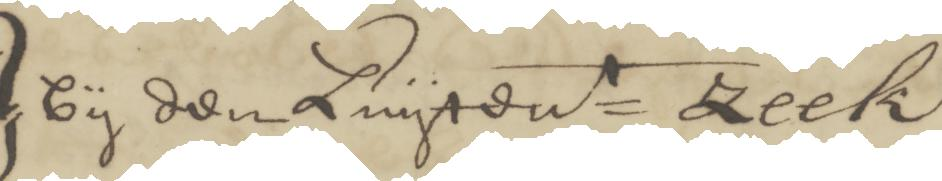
} bij den Luijten=t zeek
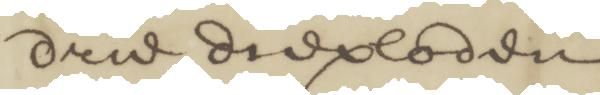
drie dieploden
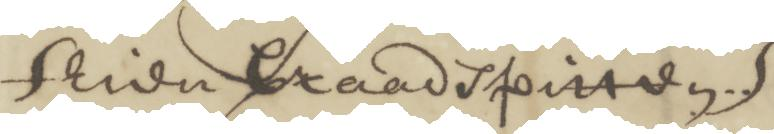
thien braadspitten - - }
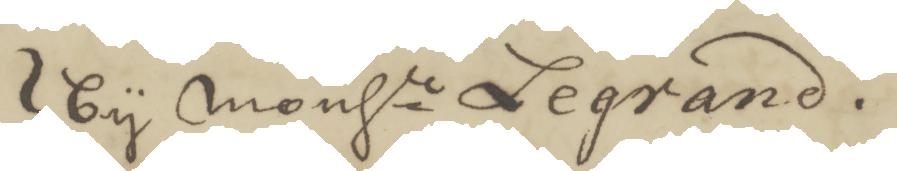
} bij Mons=r Legrand.
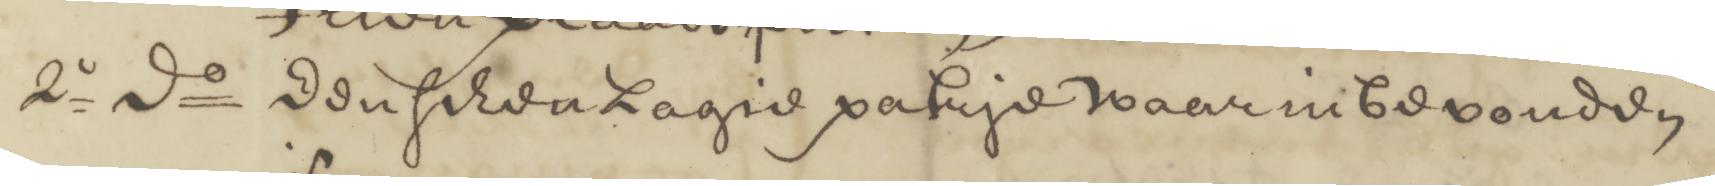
2=e d=o Een schenkagie pakje waar in bevonden
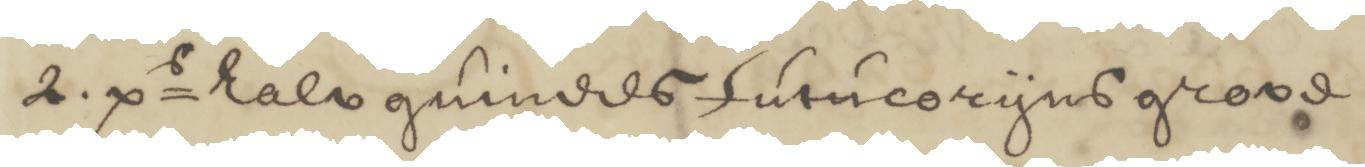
2. p=s halv guinees tutucorijns grove
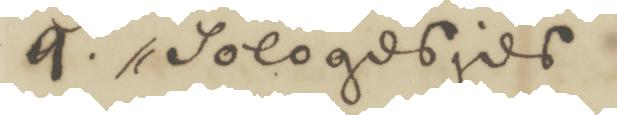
4. „ sologesjes
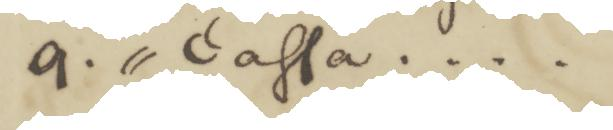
4. „ Cassa - - - -
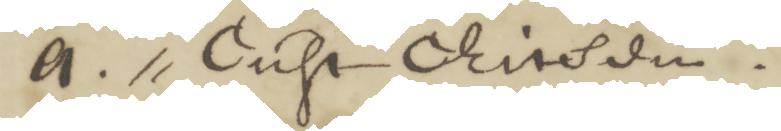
4. „ Cust Chitsen -
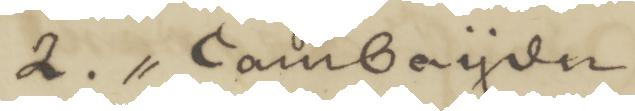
2. „ Cambaijen
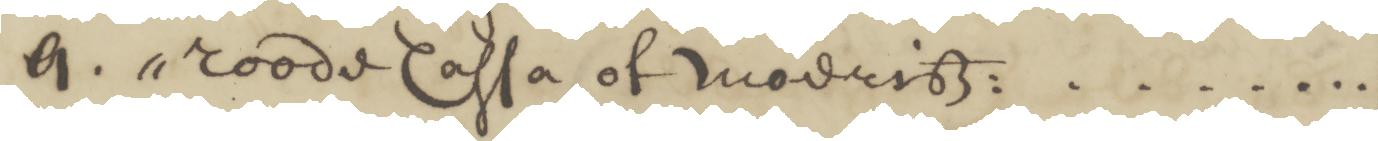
4. „ roode Cassa of Moerisz: - - - - - - -
